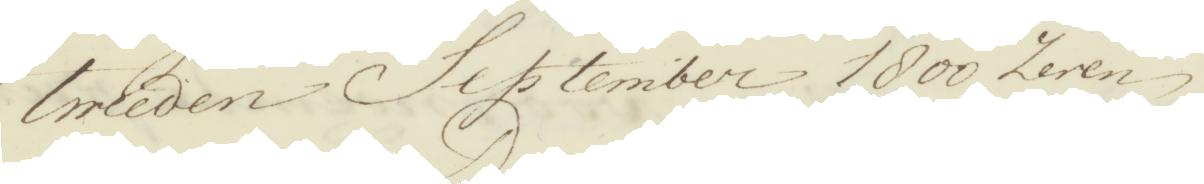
tweeden September 1800 zeven
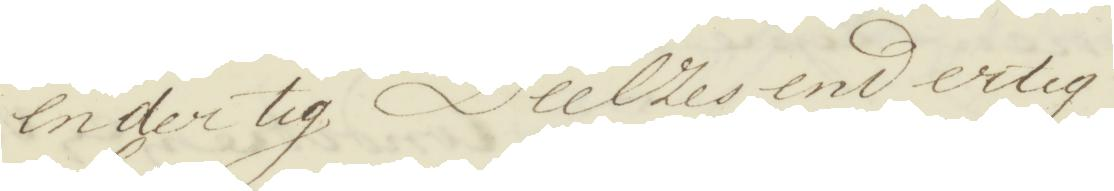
endertig Deelzes endertig
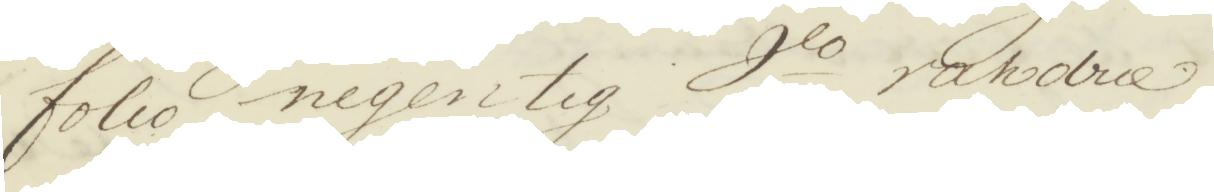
folio negentig V=o vak drie
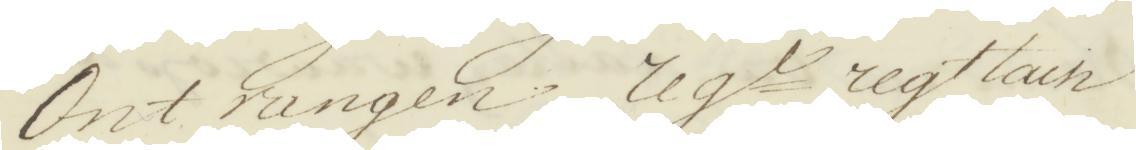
Ontvangen: reg=e regt tach
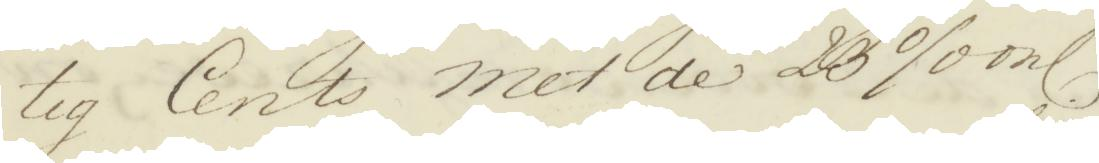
tig Cents met de 23% onC
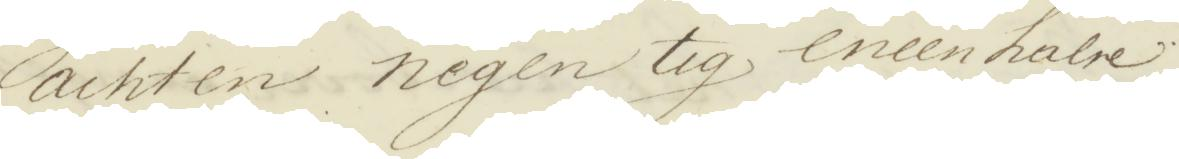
achten negentig eneen halve
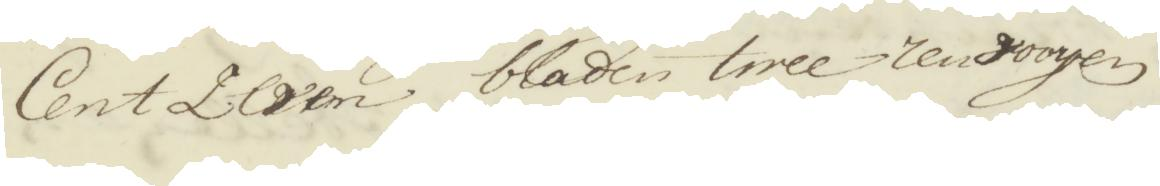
Cent zeven bladen twee renvooijen
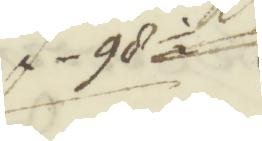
ƒ „ 98½
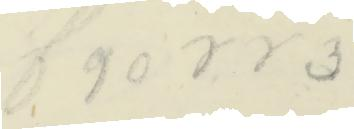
f 90 VV3
